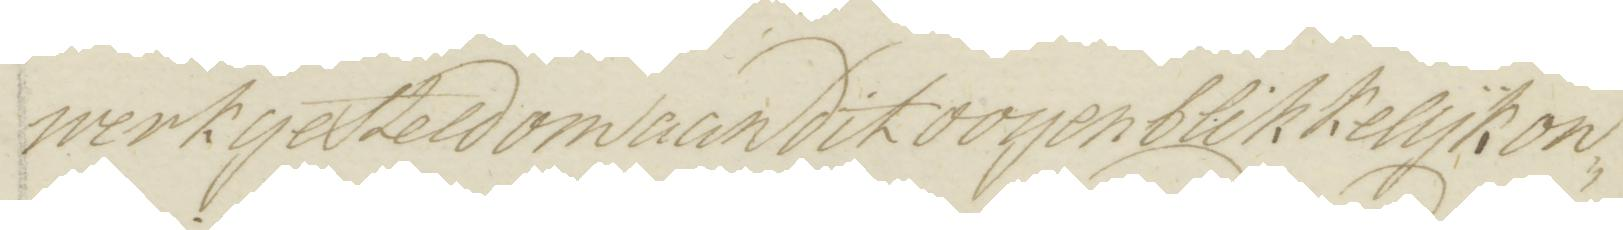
werk gesteld om aan dit oogenblikkelijk on„
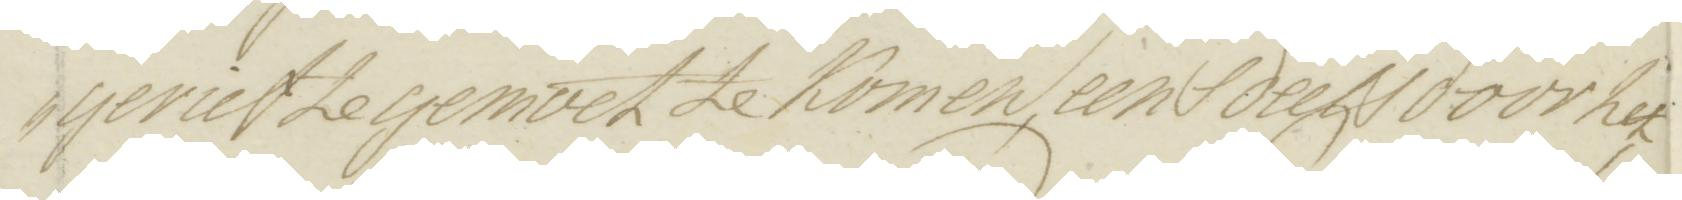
„gerief tegemoet te Komen eens deels voor het
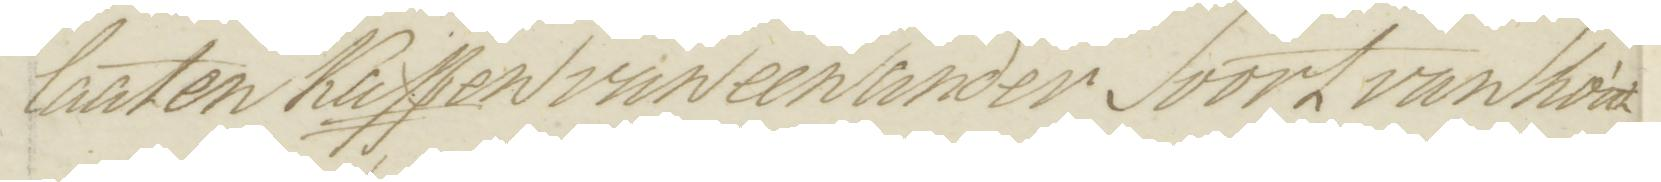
laaten kappen van een een ander Soort van hout
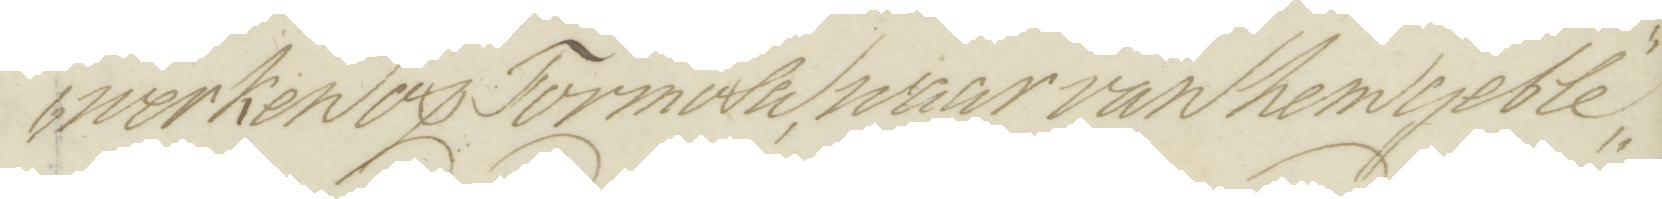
werken op Formosa waar van hem geble„
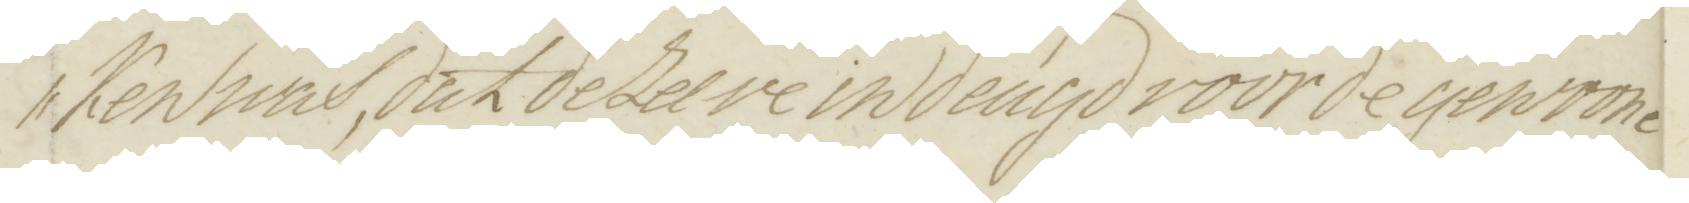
„Ken was, dat dezelve in deugd voor de gewoone
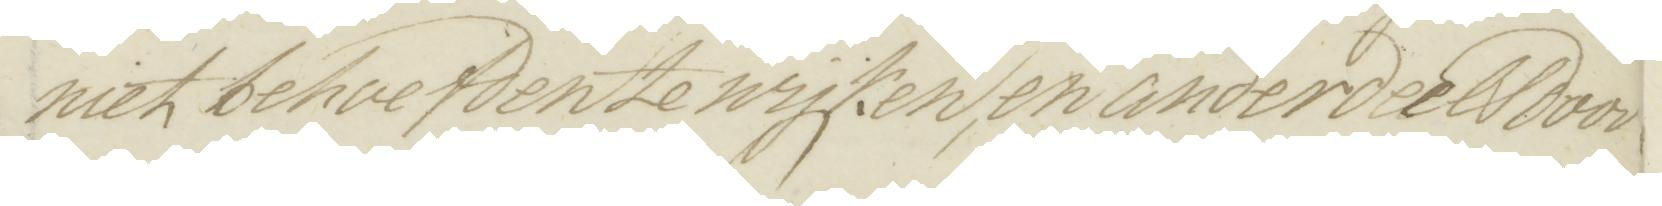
niet behoefden te wijken en ander deels door
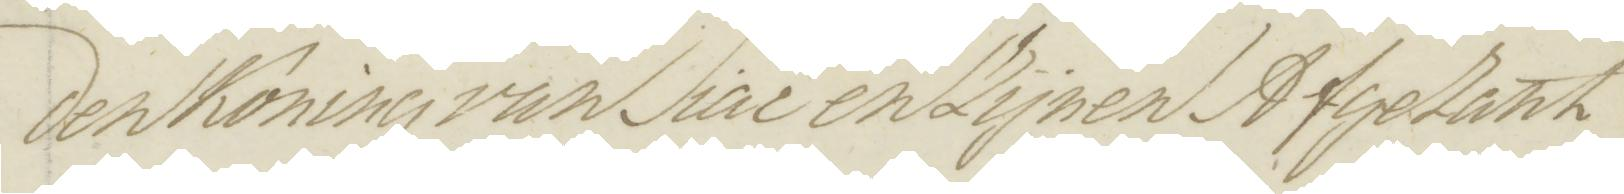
den Koning van Siac en Zijnen Afgezant
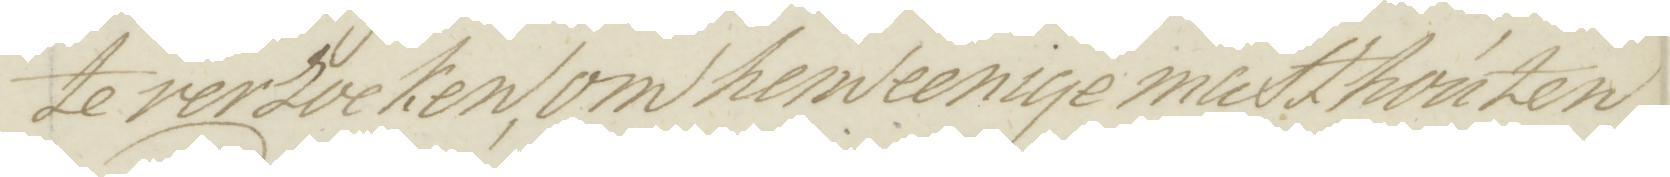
te verzoeken om hem eenige masthouten
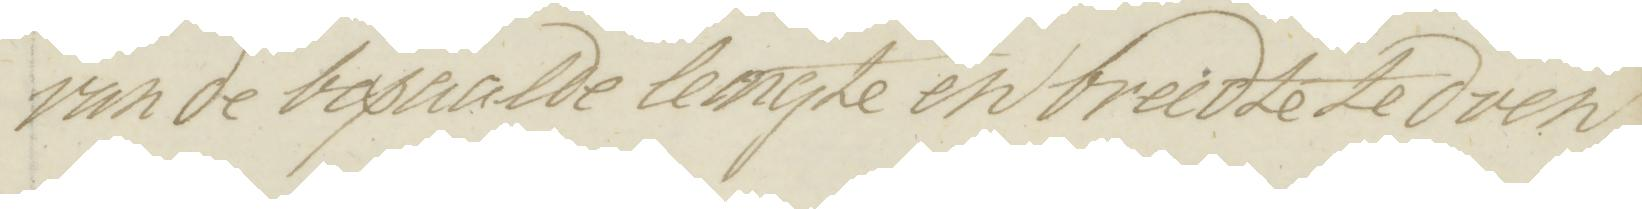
van de bepaalde lengte en breedte te doen
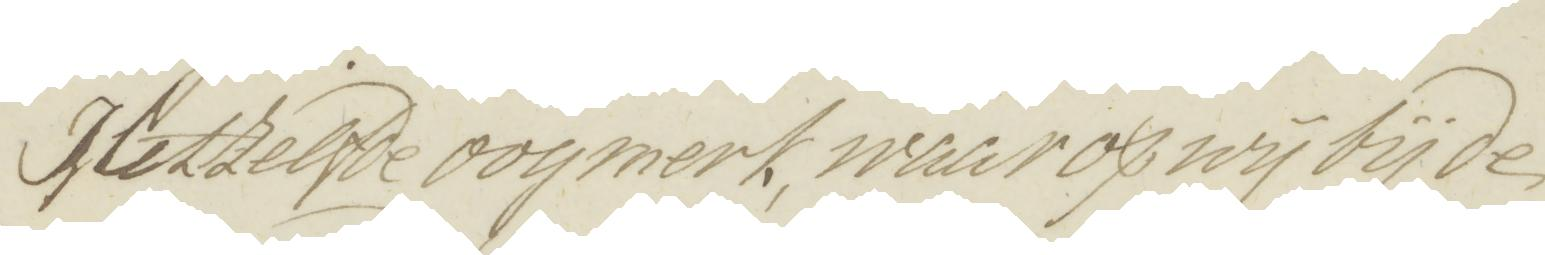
Hetzelfde oogmerk waar op wij bij de
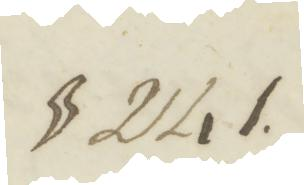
SS 241.
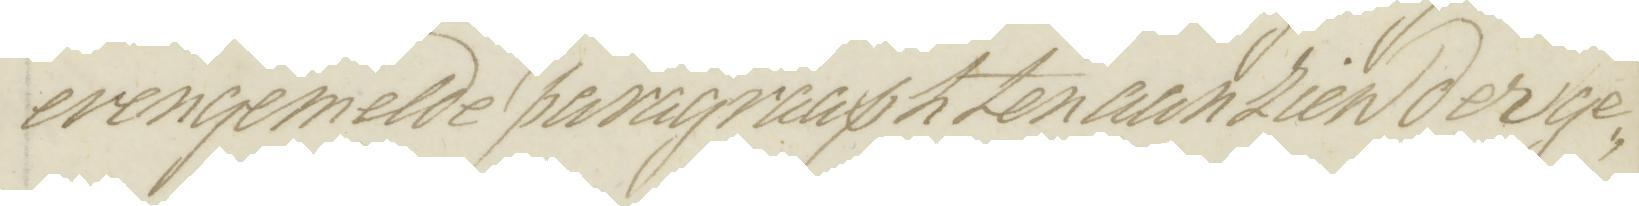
evengemelde paragraaph ten aanzien der ge=
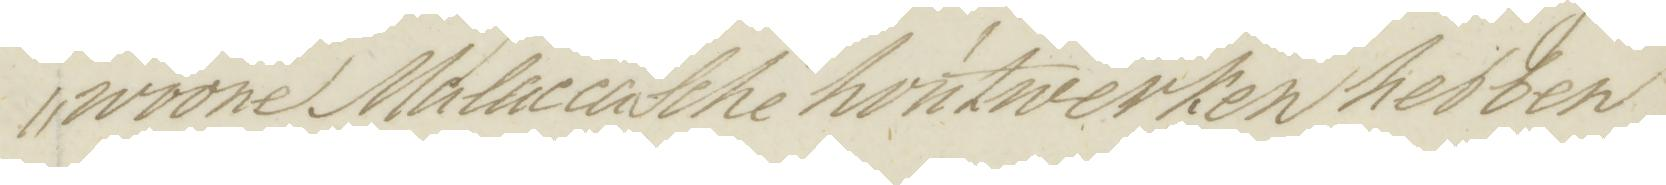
„woone Malaccasche houtwerken hebben
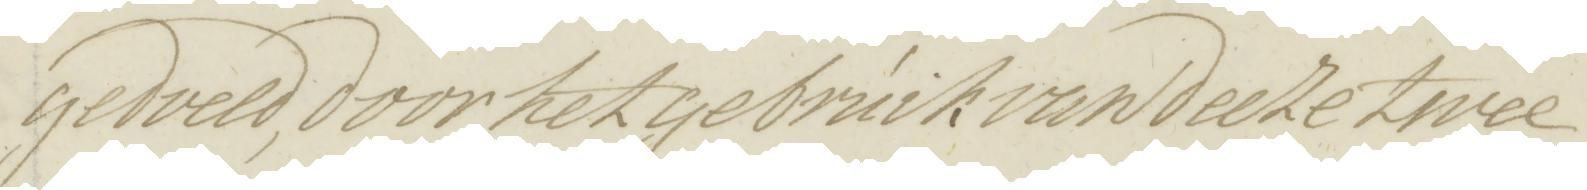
geveld door het gebruik van deze twee
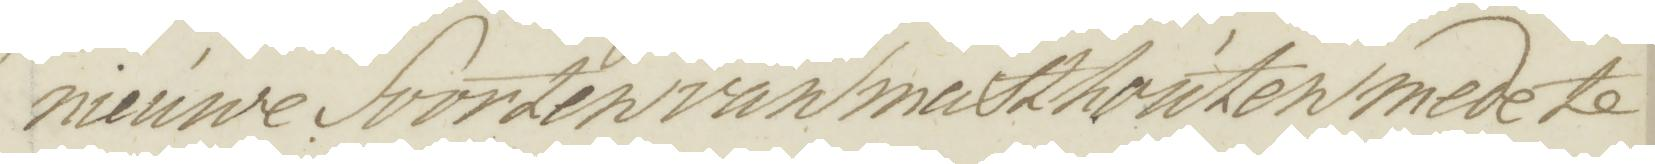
nieuwe Soorten van masthouten mede te
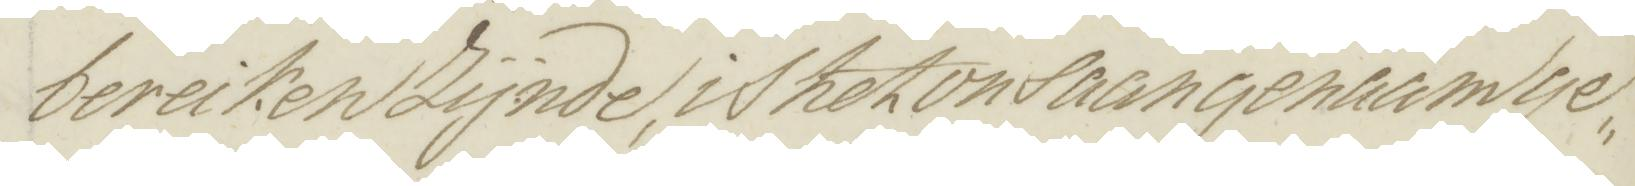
bereiken Zijnde is het ons aangenaam ge„
